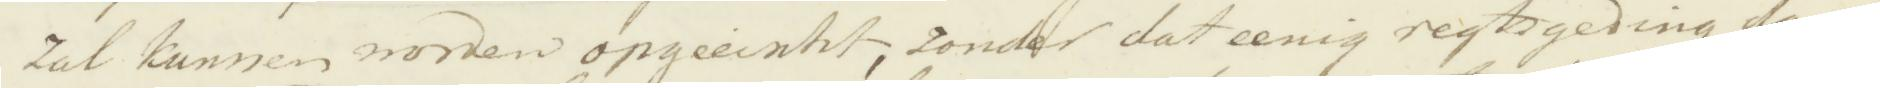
zal kunnen worden opgeeischt, zonder dat eenig regtsgeding dan
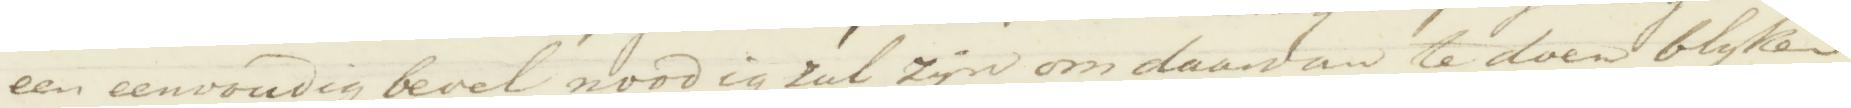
een eenvoudig bevel noodig zal zijn om daarvan te doen blyken
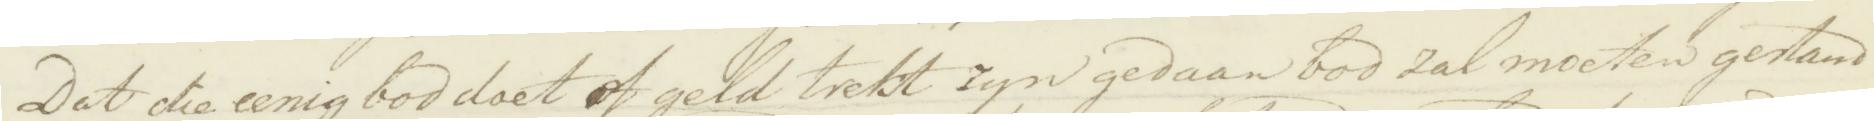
Dat die eenig bod doet of geld trekt zyn gedaan bod zal moeten gestand
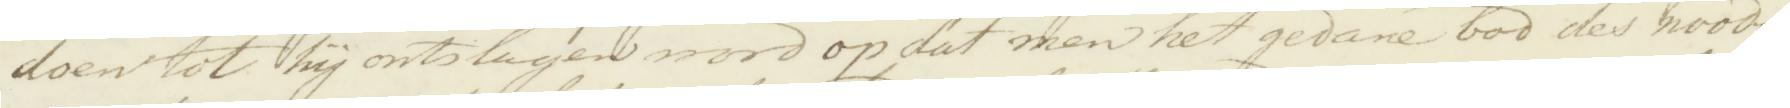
doen tot hij ontslagen word op dat men het gedane bod des noods
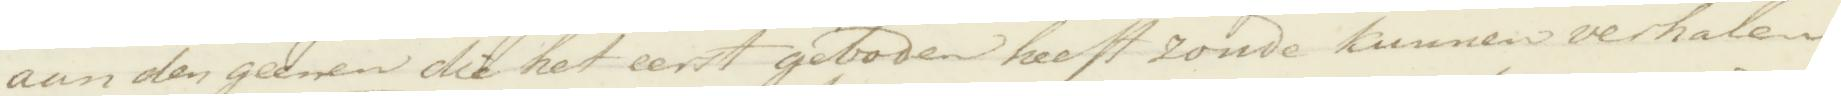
aan den geenen die het eerst geboden heeft zoude kunnen verhalen
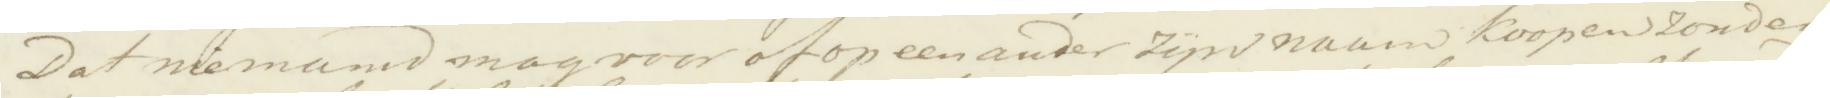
Dat niemand mag voor of op een ander zijn naam koopen zonder
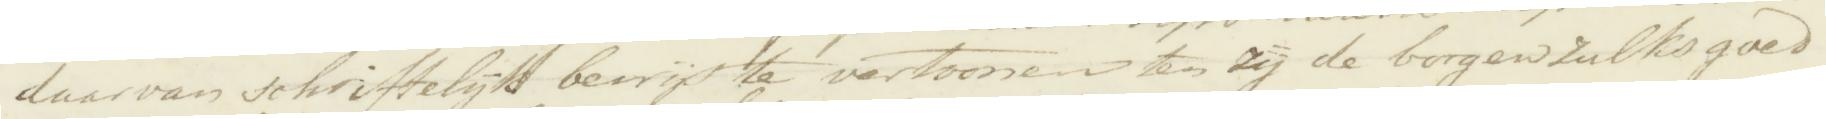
daarvan schriftelijk bewijs te vertoonen ten zij de borgen zulks goed
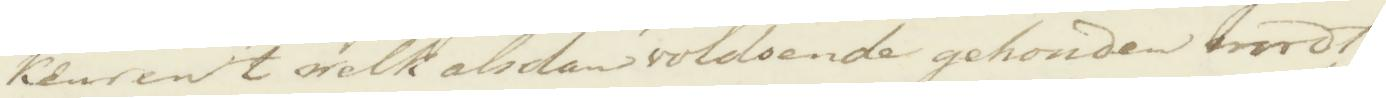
keuren ’t welk als dan voldoende gehouden wordt
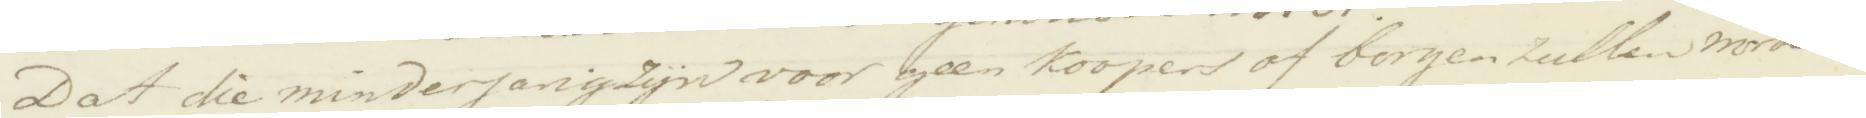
Dat die minderjarig zijn voor geen koopers of borgen zullen worden
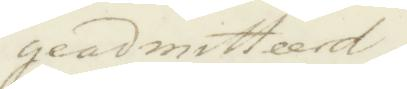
geadmitteerd
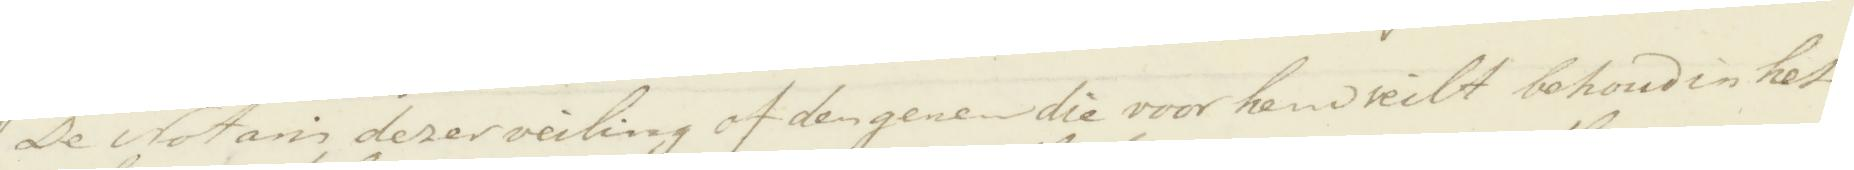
De Notaris dezer veiling of dengenen die voor hem veilt behoud in het
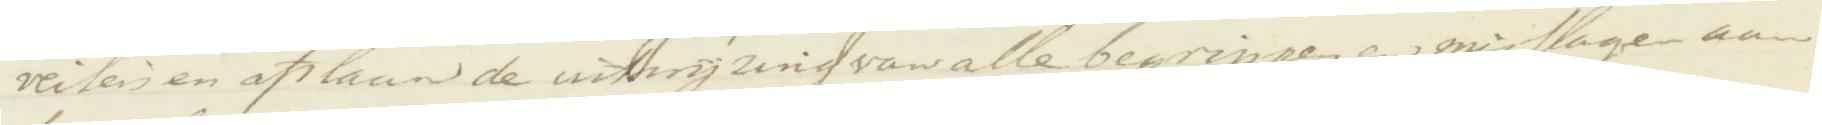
veilen en afslaan de uitwijzing van alle begrippen en misslagen aan
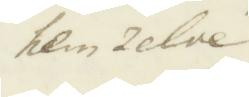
hem zelve
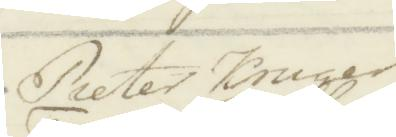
Pieter Kruger
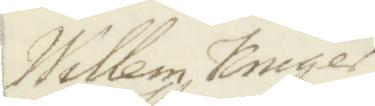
Willem Kruger
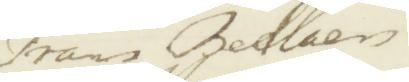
Frans Bellaers
